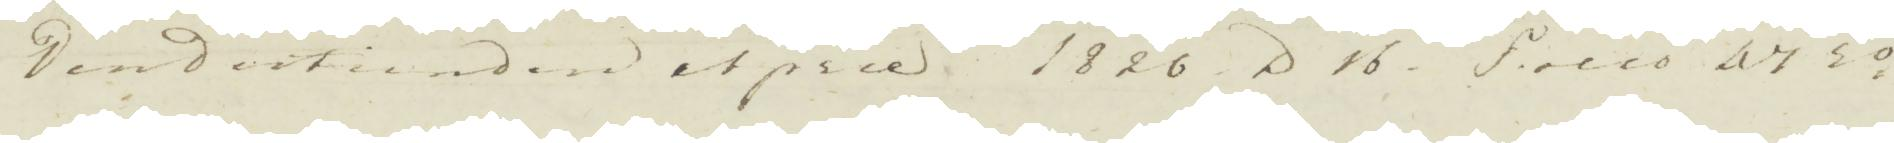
Den dertienden April 1826 D 16. Folio 47 v=o
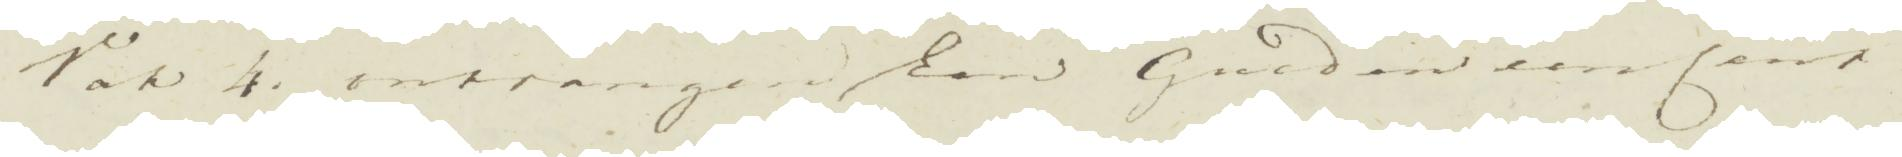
Vak 4. ontvangen Een Gulden een Cent
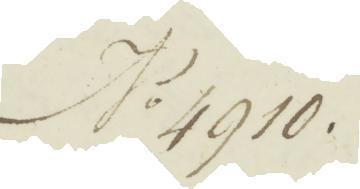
N:o 4910.
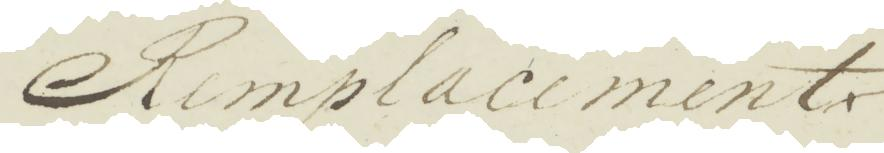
Remplacement
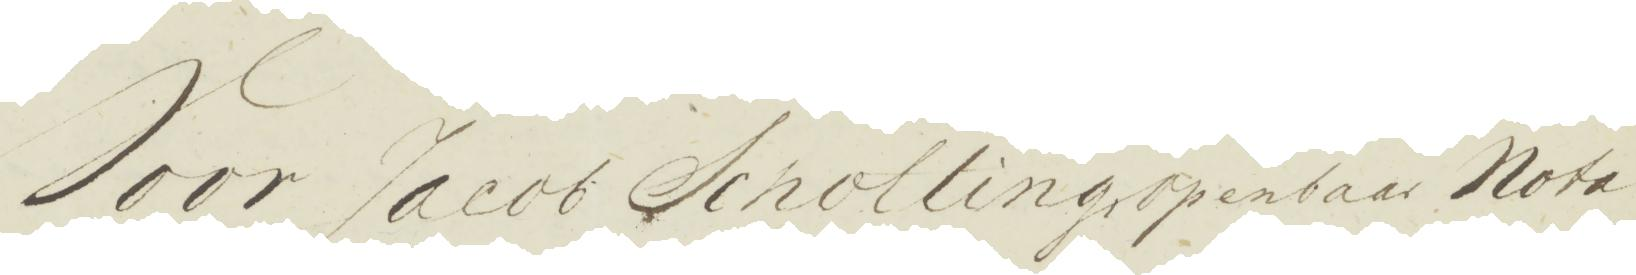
Voor Jacob Scholting, openbaar Nota
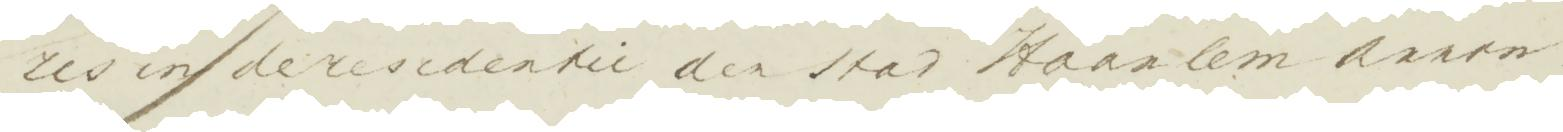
ris in de residentie der stad Haarlem arron
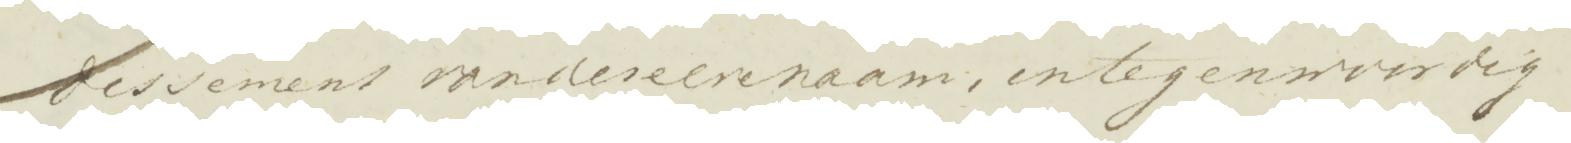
dissement van deselve naam, in tegenwoordig
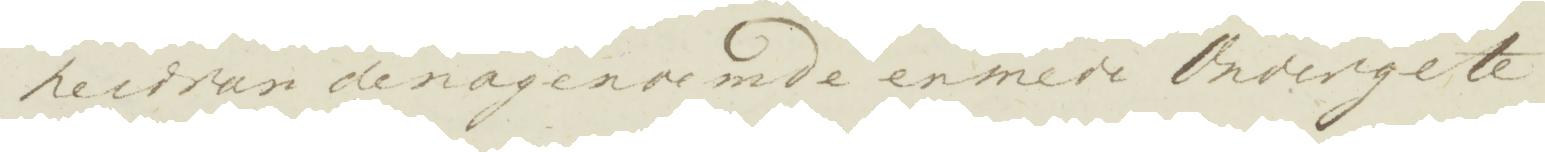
heidvan de nagenoemde en mede Ondergete
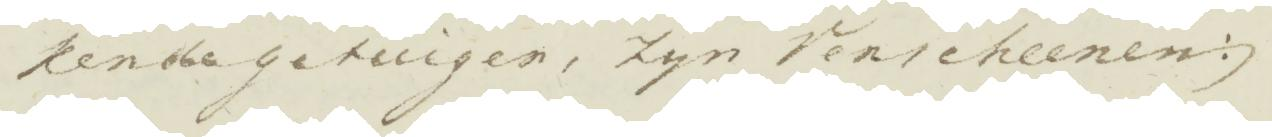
kende getuigen, zijn Verscheenen:
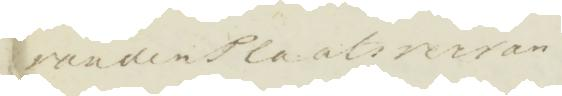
van den Plaats vervan
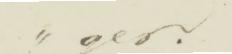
„ ger.
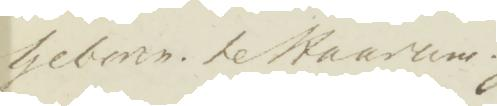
Geboren: te Haarlem.
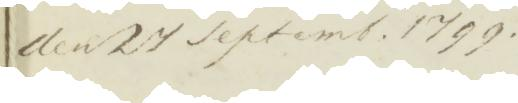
den 27 Septemb. 1799
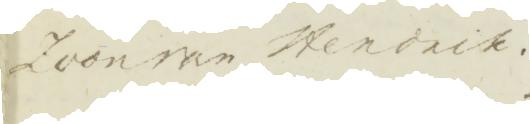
Zoon van Hendrik.
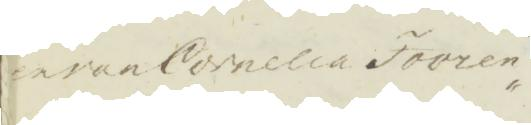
en van Cornelia Tooren„
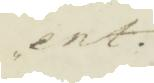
„ent.
